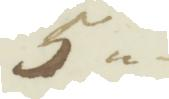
5 „ —
